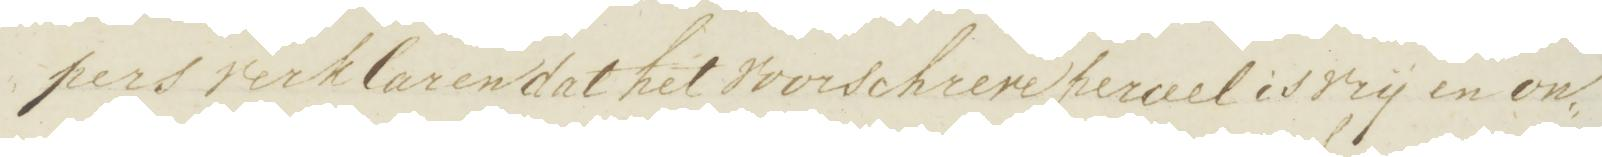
pers verklaren dat het voorschreve perceel is vrij en on„
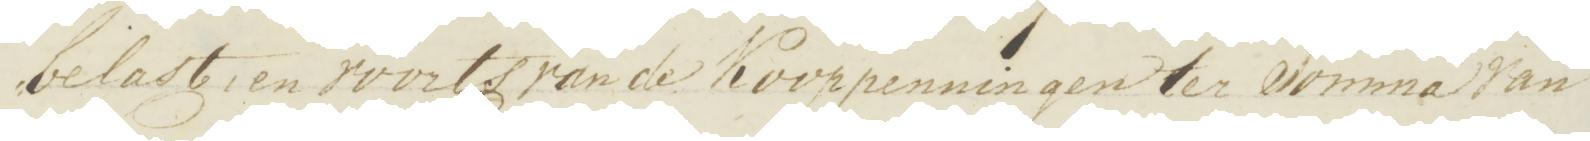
„belast, en voorts van de Kooppenningen ter Somma van
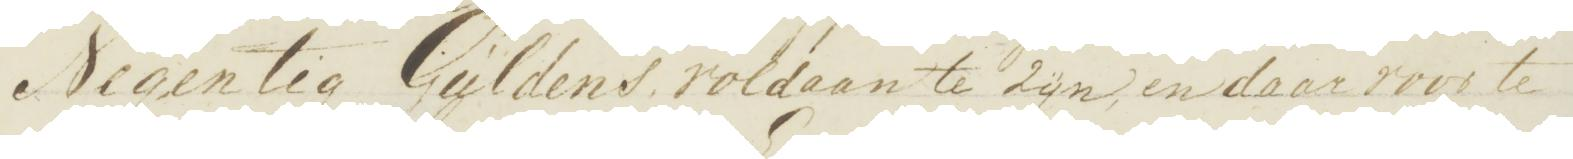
Negentig Guldens, voldaan te zijn, en daar voor te
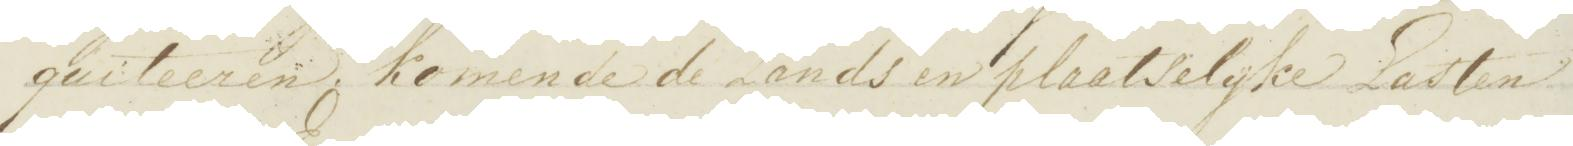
quiteeren, komende de Lands en plaatselijke Lasten
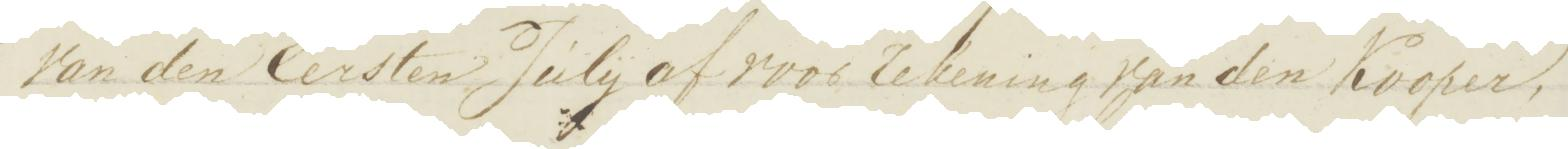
van den Eersten Julij af voor rekening van den Kooper,
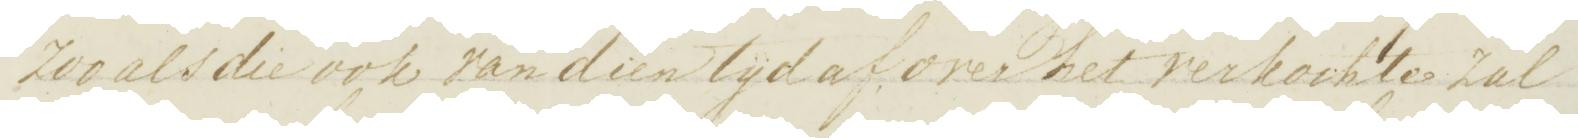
zoo als die ook van dien tijd af over het verkochte zal
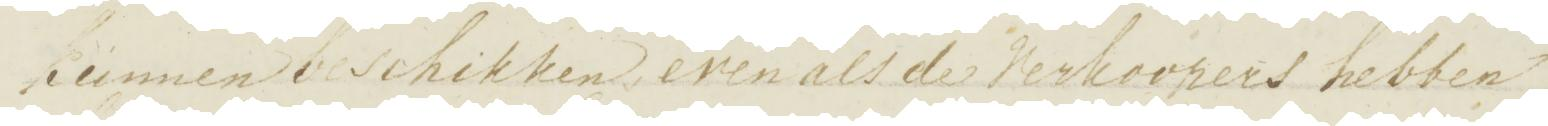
kunnen beschikken, even als de Verkoopers hebben
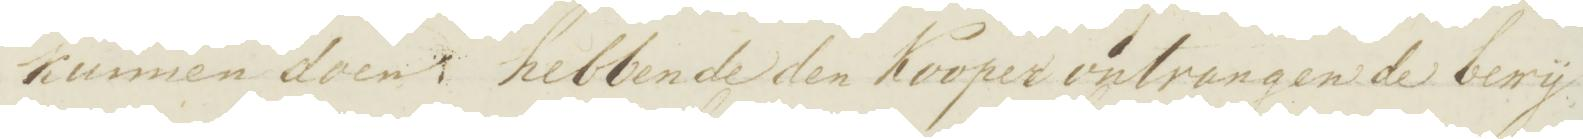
kunnen doen hebbende den Kooper ontvangen de bewij
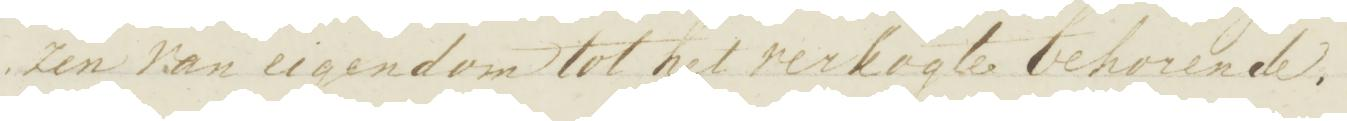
zen van eigendom tot het verkogte behorende.
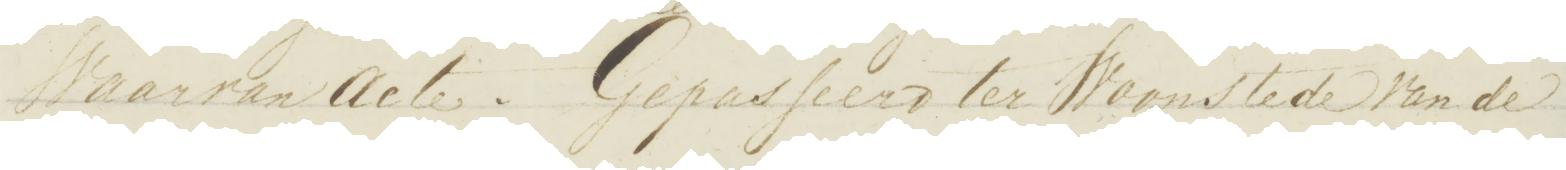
Waarvan Acte - Gepasseerd ter Woonstede van de
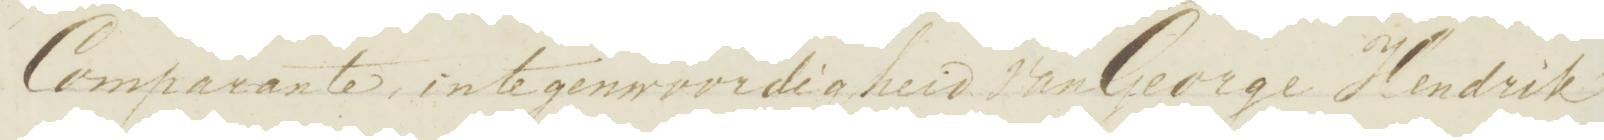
Comparante, in tegenwoordigheid van George Hendrik
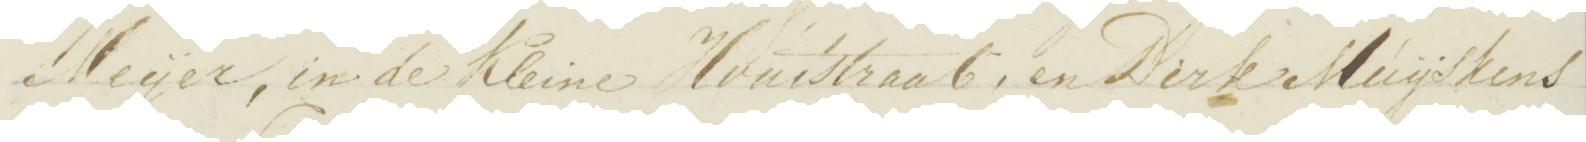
Meijer, in de Kleine Houtstraat, en Dirk Muijskens
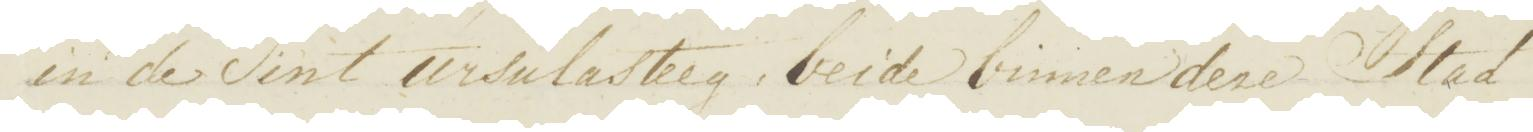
in de Sint Ursulasteeg, beide binnen deze Stad
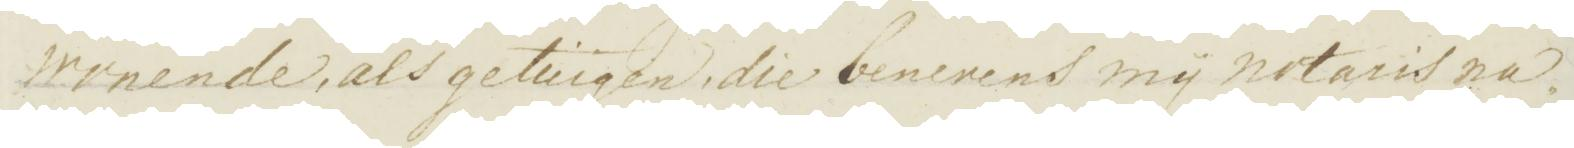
wonende, als getuigen, die benevens mij notaris na
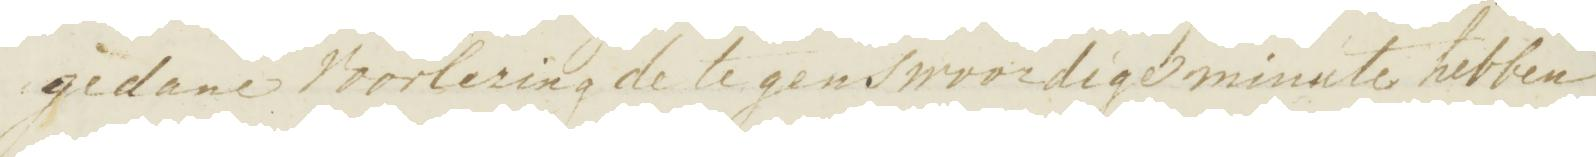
gedane voorlezing de tegenswoordige minute hebben
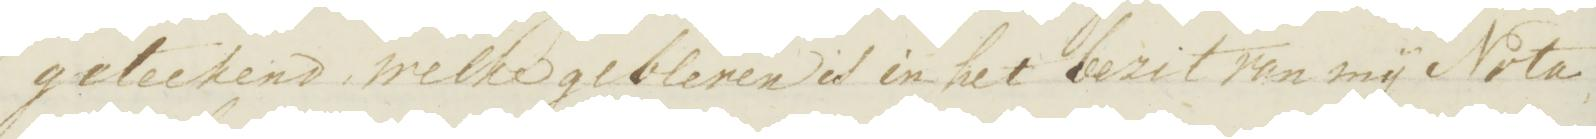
geteekend, welke gebleven is in het bezit van mij Nota
